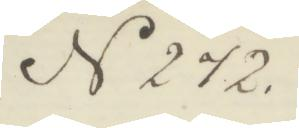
N 272.
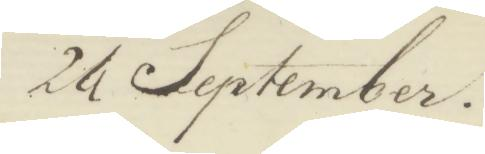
24 September.
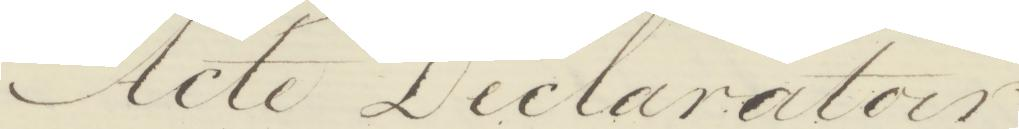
Acte Declaratoir
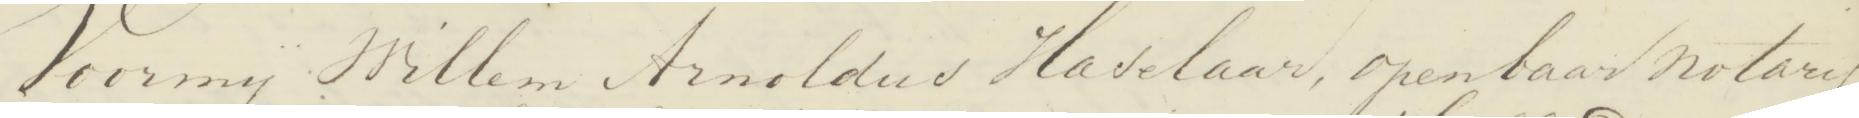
Voormij Willem Arnoldus Haselaar, openbaar notaris
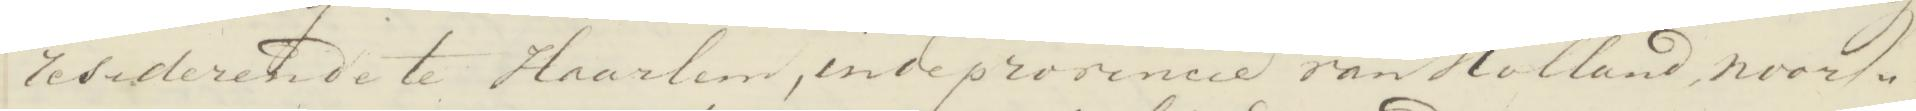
residerende te Haarlem, in de provincie van Holland, noor„
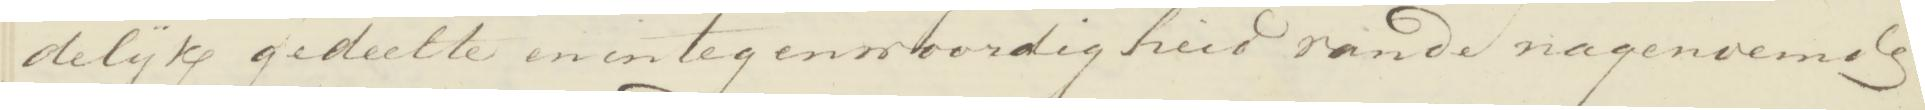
delijk gedeelte en in tegenwoordigheid van de nagenoemde
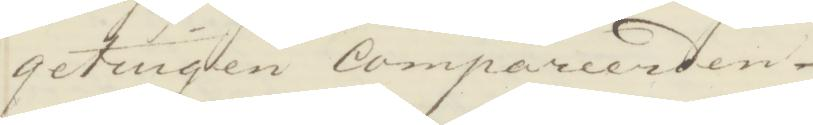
getuigen Compareerden
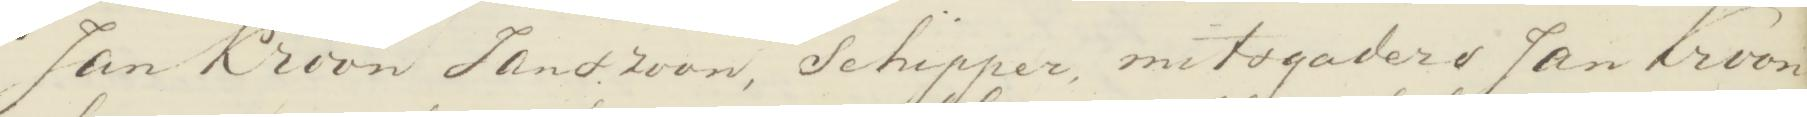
Jan Kroon Ians zoon, schipper, mitsgaders Jan Kroon
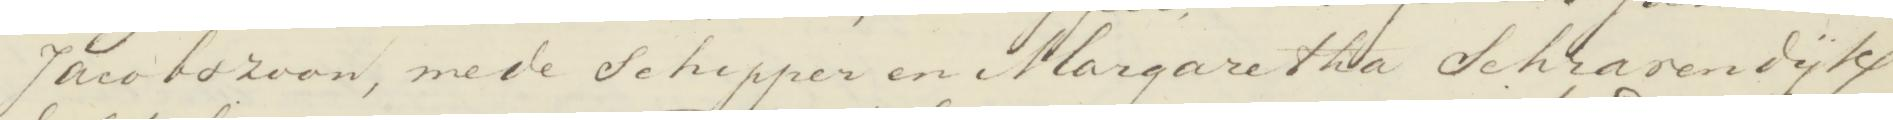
Jacobszoon, mede schipper en Margaretha Schravendijk
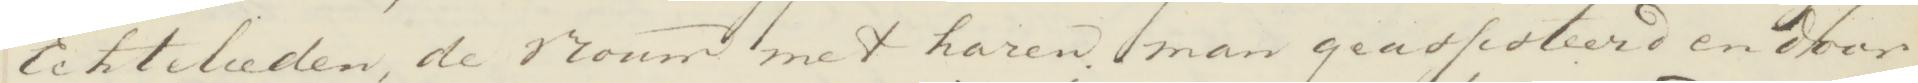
Echtelieden, de Vrouw met haren man geassisteerd en door
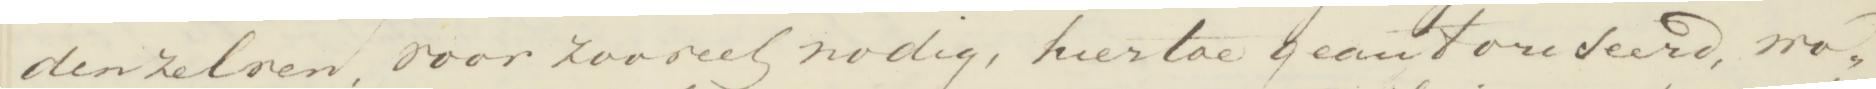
den zelven, voor zooveel nodig, hier toe geautoriseerd, wo„
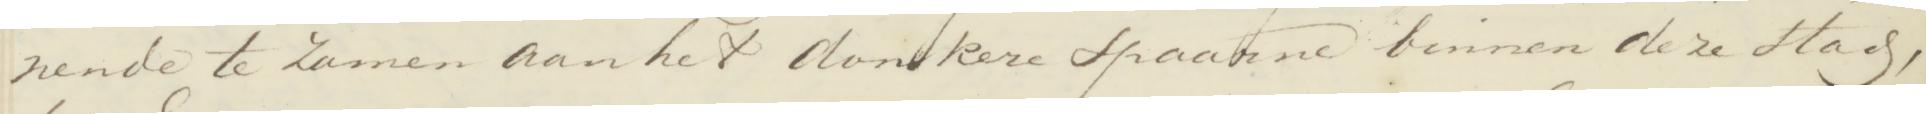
nende te zamen aan het donkere spaarne binnen deze stad,
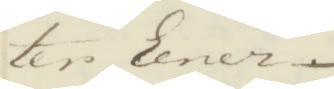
ten Eener
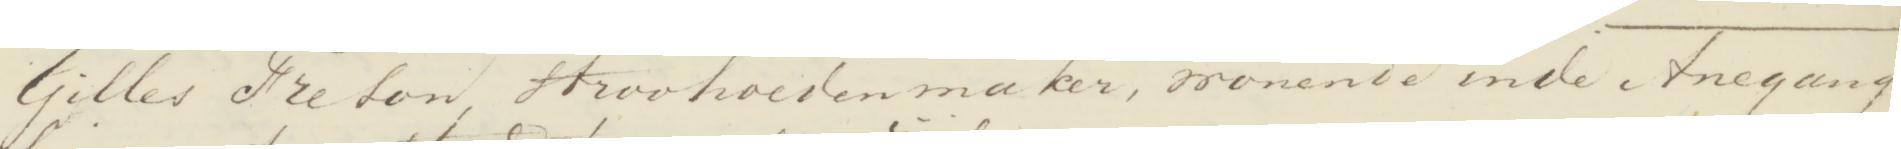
Gilles Freson, stroohoedenmaker, wonende in de Anegang
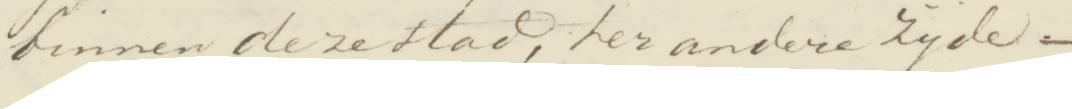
binnen deze stad, ter andere zijde
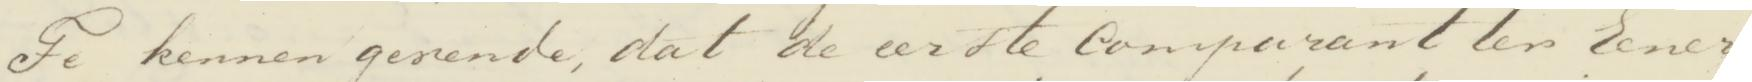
Te kennen gevende, dat de eerste comparant ter Eener
